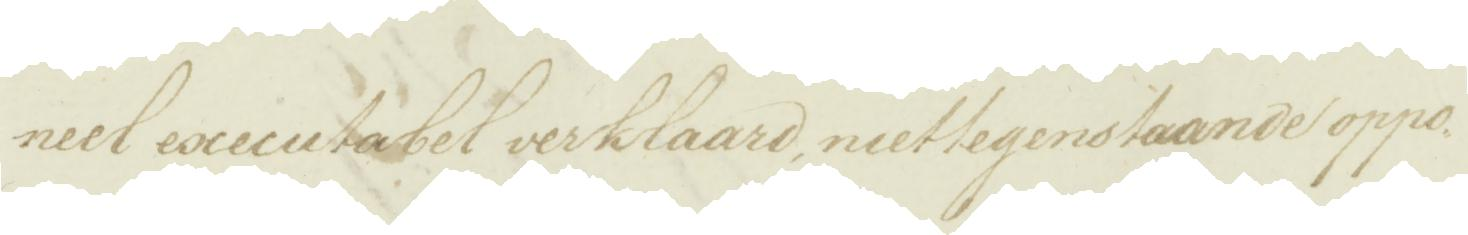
neel executabel verklaard, niettegenstaande oppo„
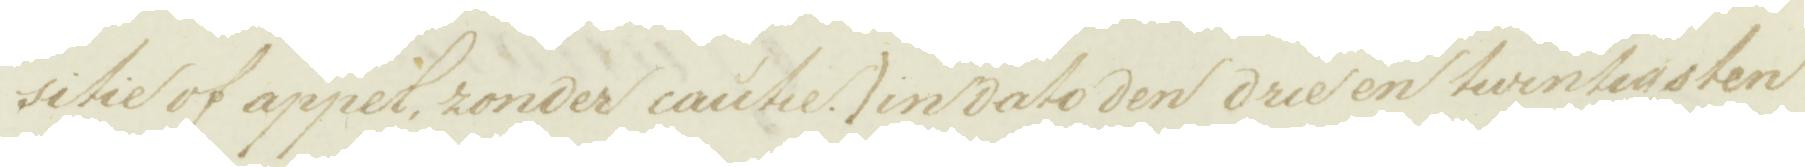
sitie of appel, zonder cautie.) in dato den drie en twintigsten
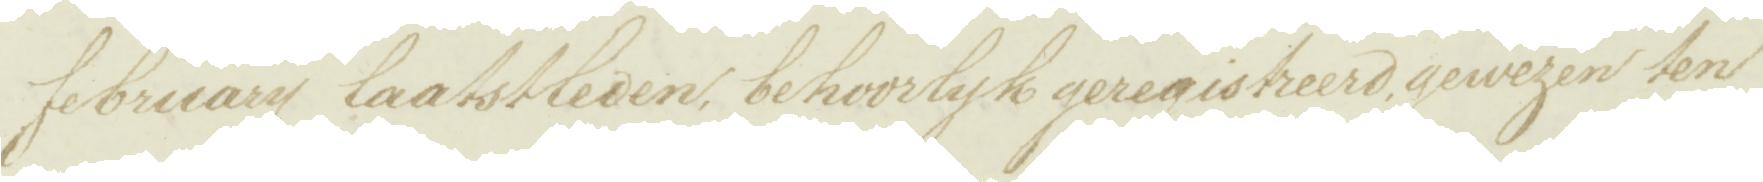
february laatstleden, behoorlyk geregistreerd, gewezen ten
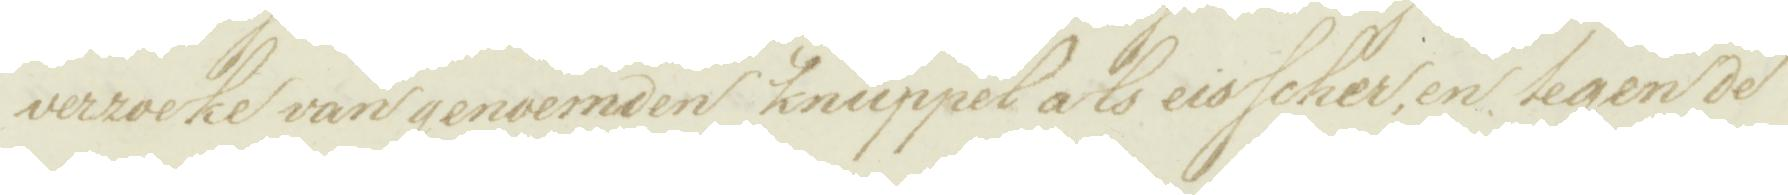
verzoeke van genoemden knuppel als eisscher, en tegen de
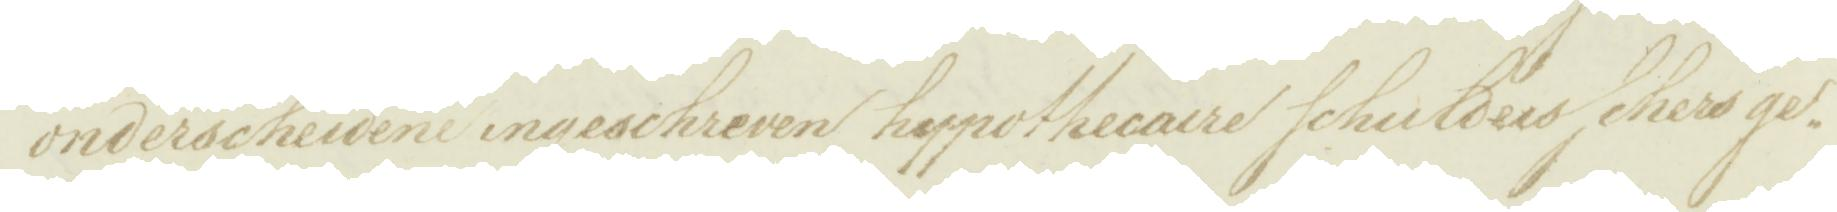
onderscheidene ingeschreven hypothecaire schuldeisschers ge„
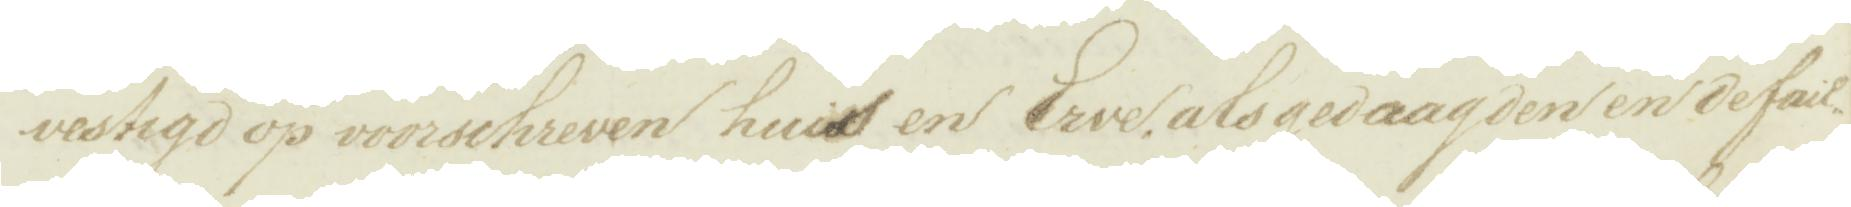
vestigd op voorschreven huis en Erve, als gedaagden en defail„
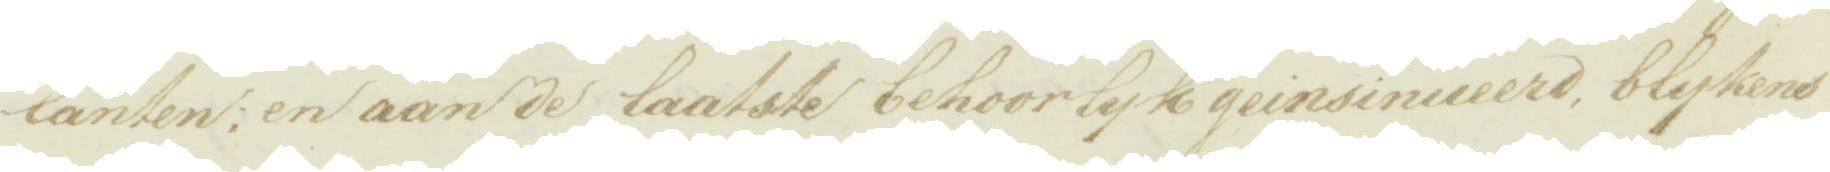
lanten; en aan de laatste behoorlyk geinsinueerd, blykens
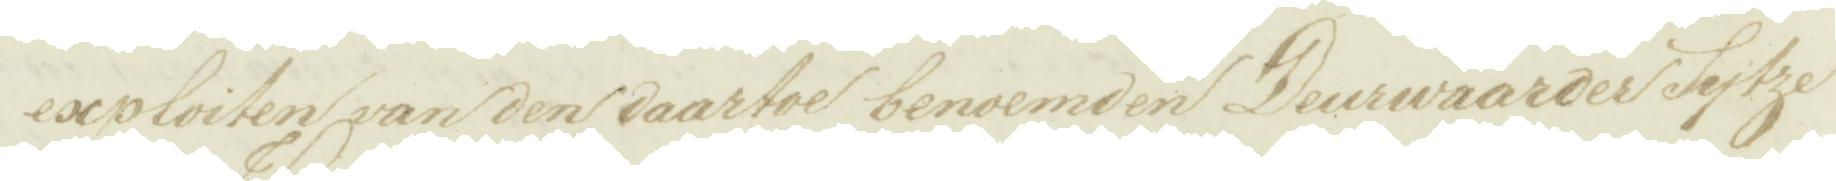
exploiten van den daartoe benoemden Deurwaarder Sytze
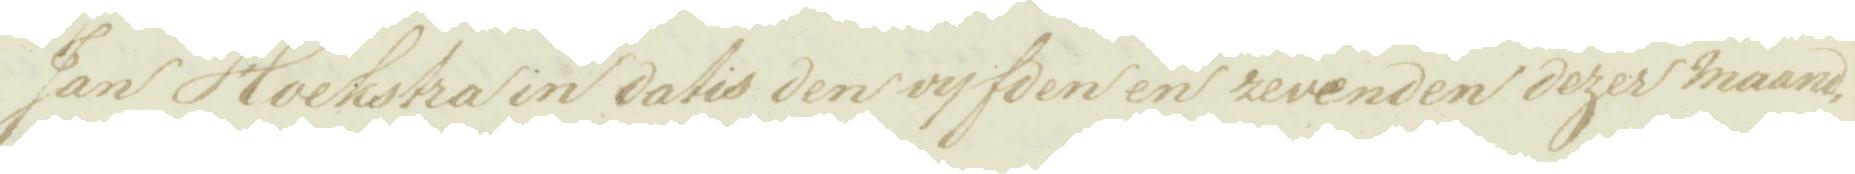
Jan Hoekstra in datis den vyfden en zevenden dezer maand,
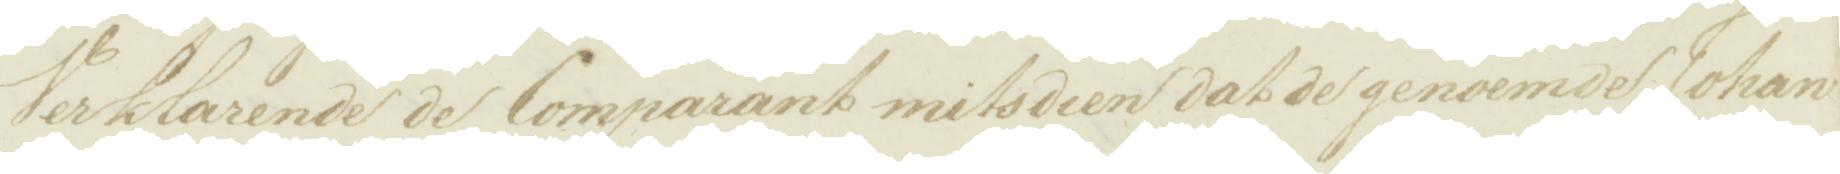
Verklarende de Comparant mitsdien dat de genoemde Johan
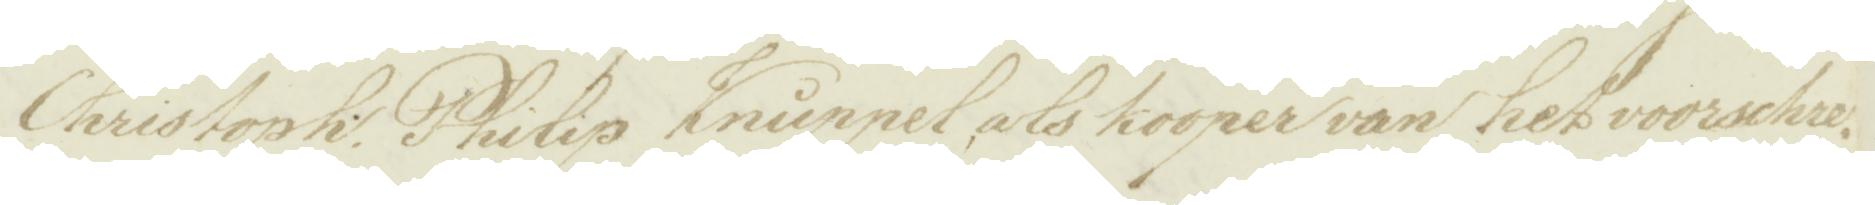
Christoph, Philip Knuppel als kooper van het voorschre„
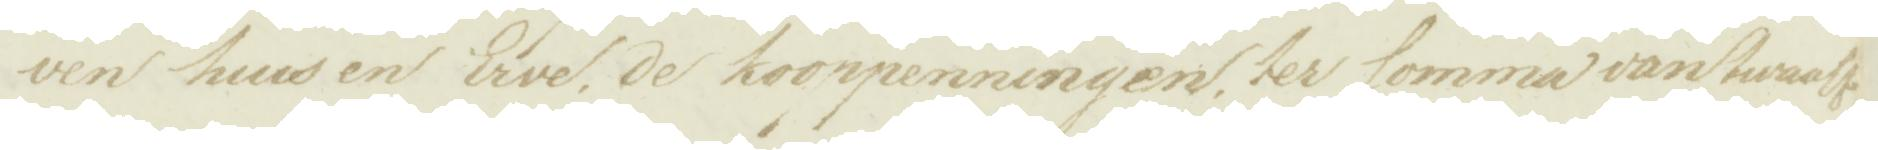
ven huis en Erve, de kooppenningen, ter somma van twaalf
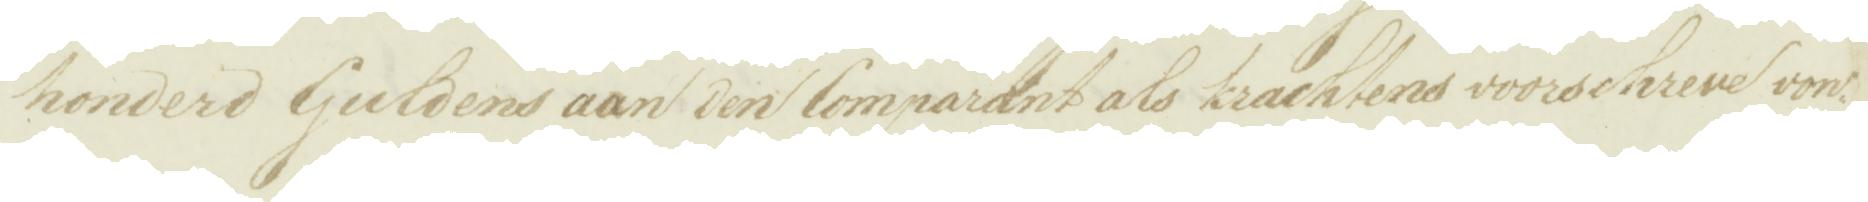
honderd Guldens aan den Comparant als krachtens voorschreve von„
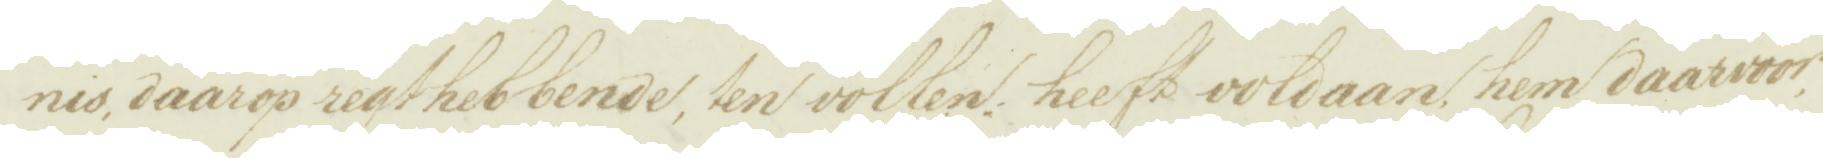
nis, daarop regt hebbende, ten vollen, heeft voldaan, hem daarvoor
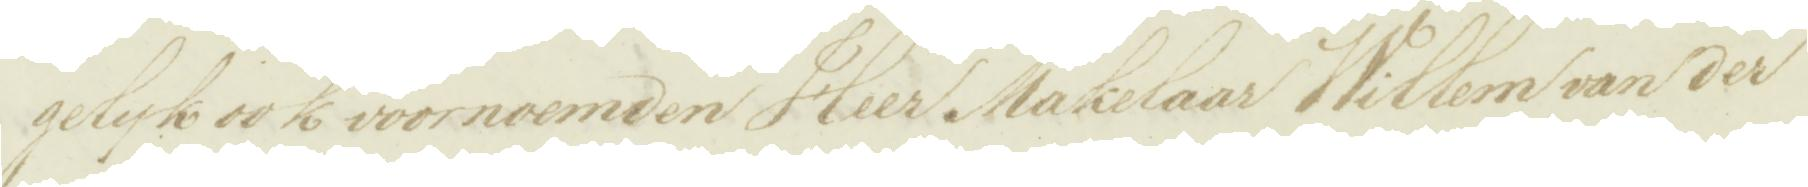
gelyk ook voornoemden Heer Makelaar Willem van der
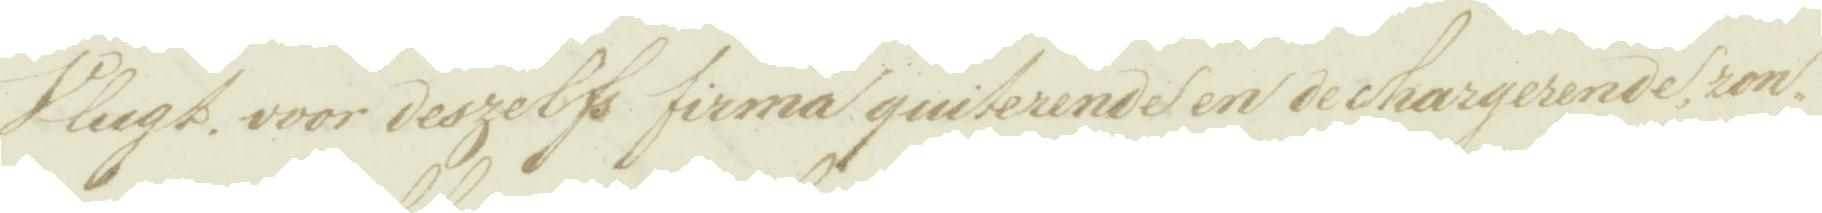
Vlugt. voor deszelf firma quiterende en dechargerende, zon„
